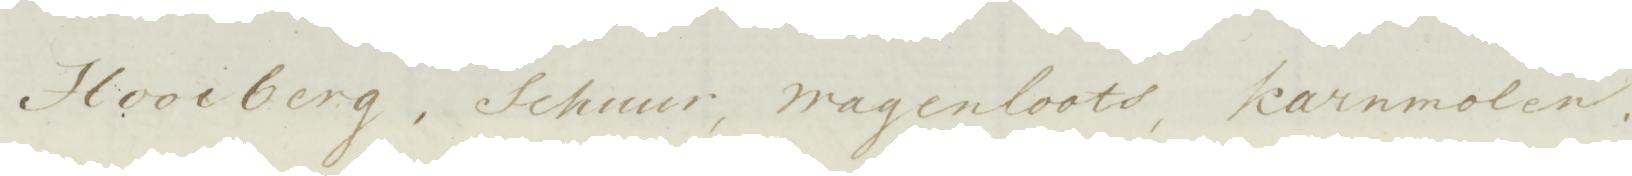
Hooiberg, Schuur, wagenloots, karnmolen,
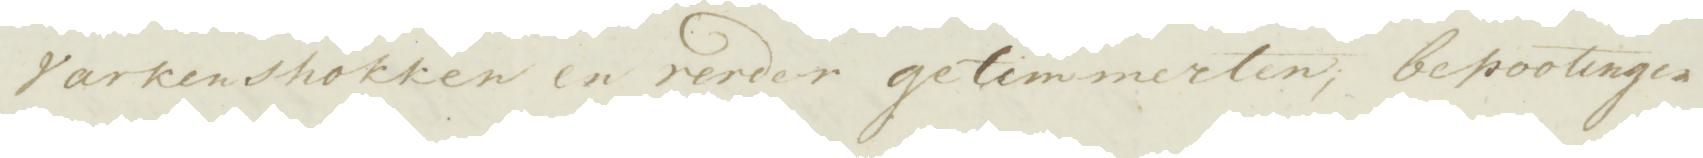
Varkenshokken en verder getimmerten; bepootingen
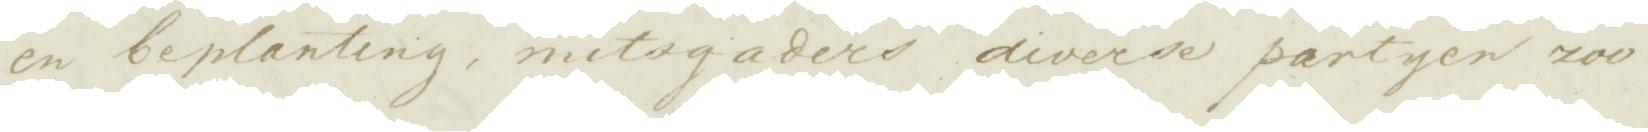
en beplanting, mitsgaders diverse partijen zoo
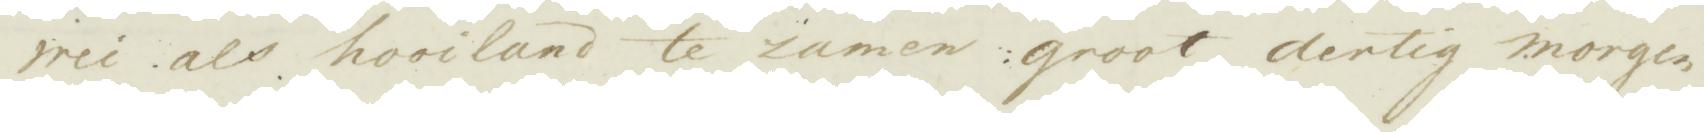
wei als hooiland te zamen: groot dertig morgen
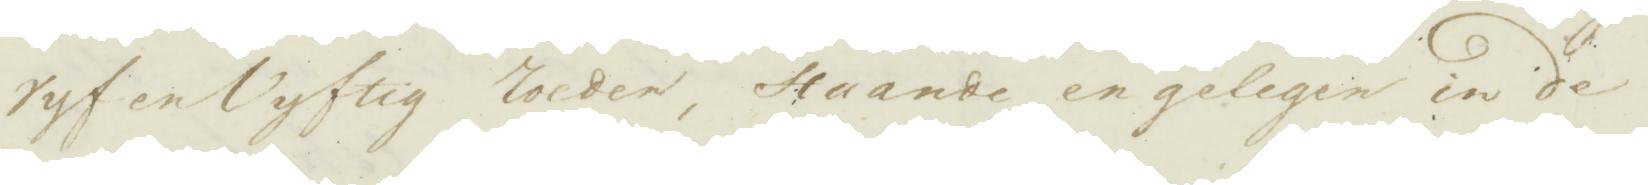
vyf en Vyftig roeden, staande en gelegen in de
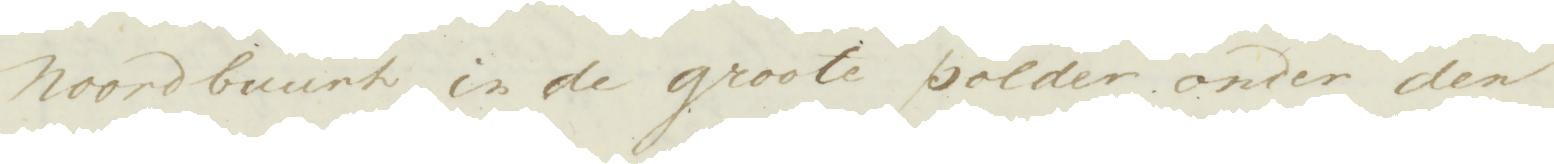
Noordbuurt in de groote polder onder den
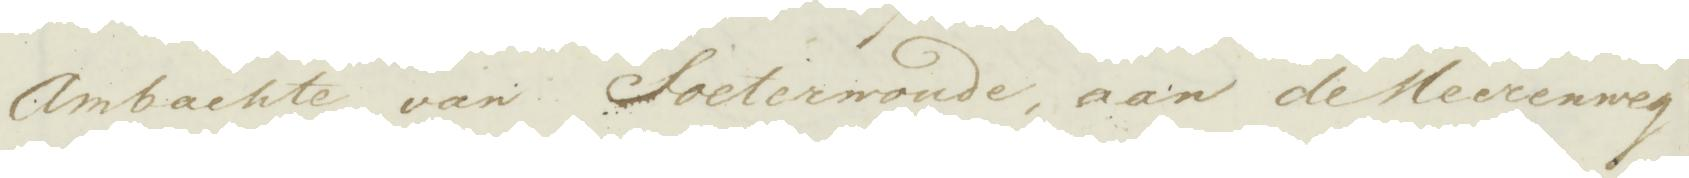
Ambachte van Soeterwoude, aan de Heerenweg
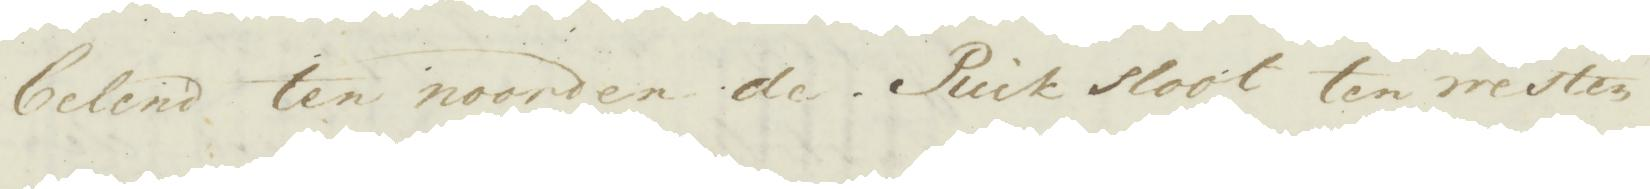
belend ten noorden de Puiksloot ten westen
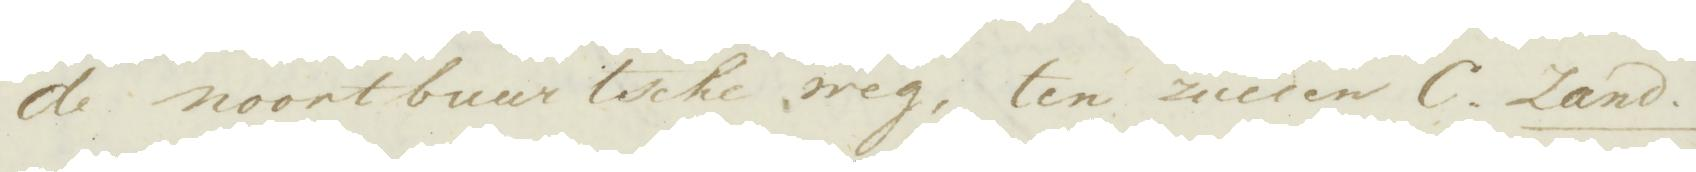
de, noortbuurtsche weg, ten zuiden C. Land.
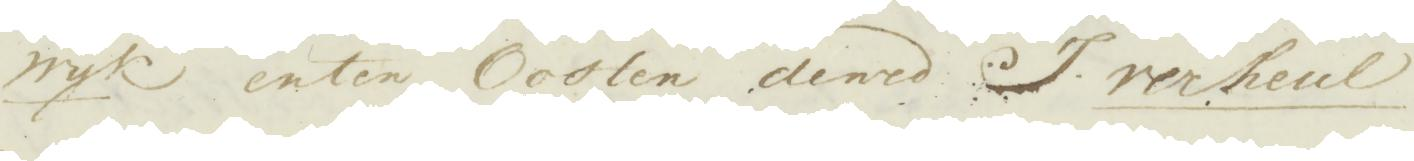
wyk en ten Oosten de wed: J. verheul
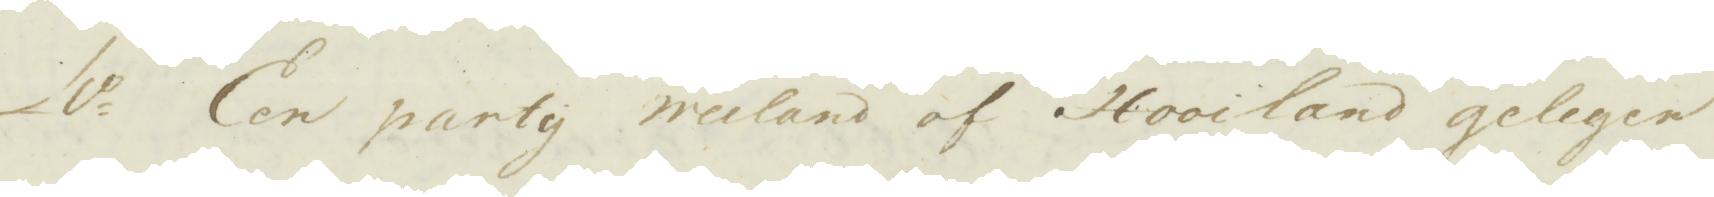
4=o Een partij weiland of Hooiland gelegen
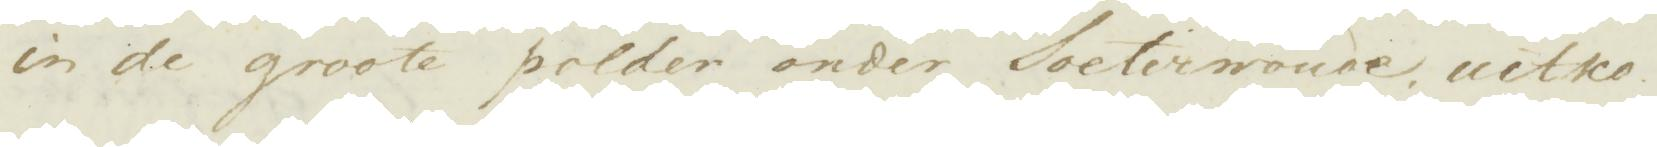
in de groote polder onder soeterwoude, uitko
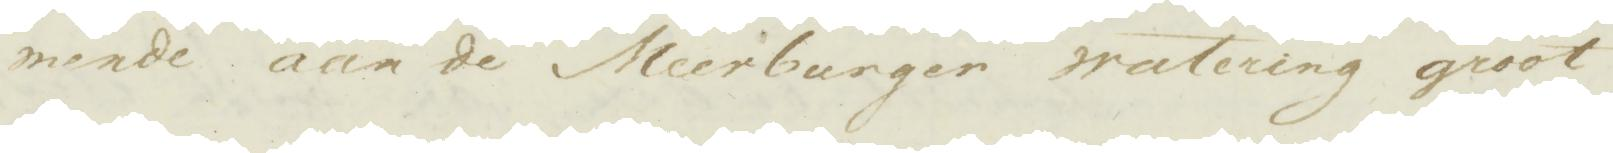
mende aan de Meerburger watering groot
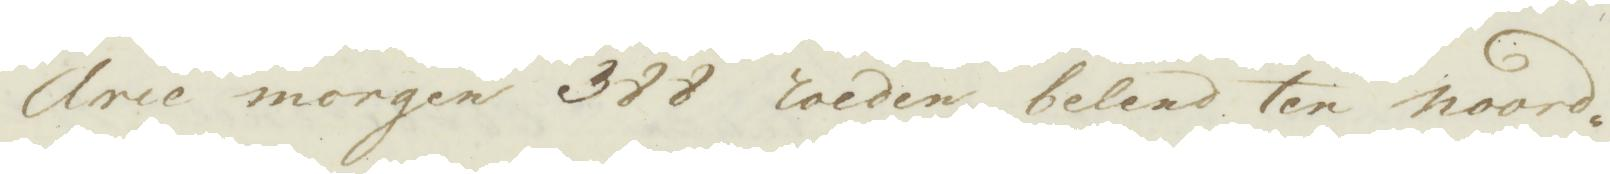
drie morgen 388 roeden belend ten noord„
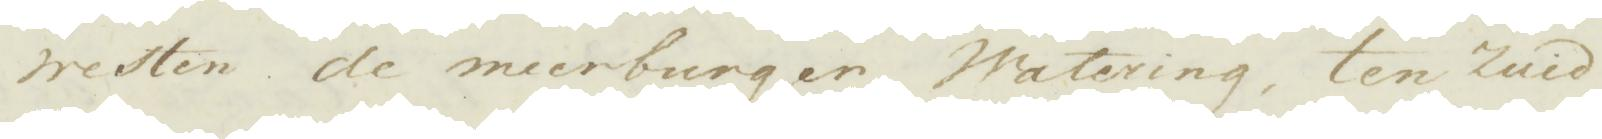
westen de meerburger watering, ten zuid
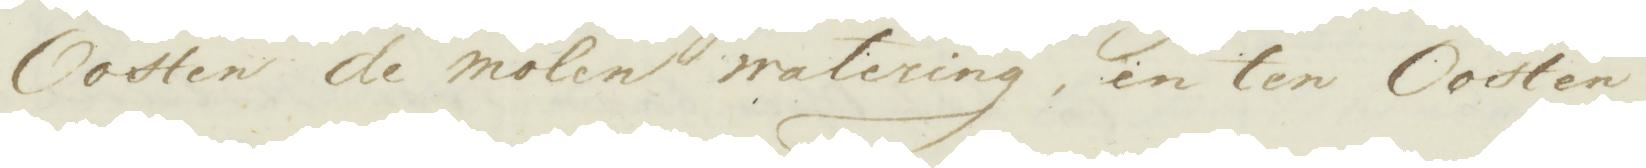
Oosten de molen watering, in ten Oosten
